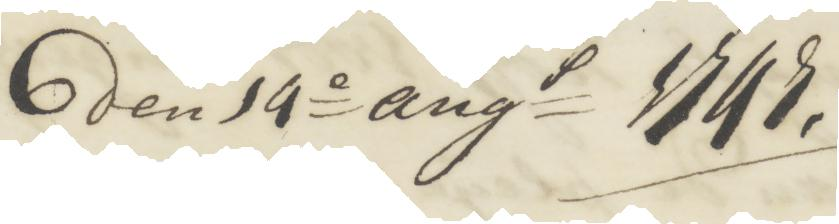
den 14=e aug=s 1747.
